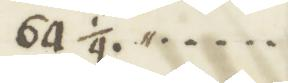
64 ¼. „ . . . .
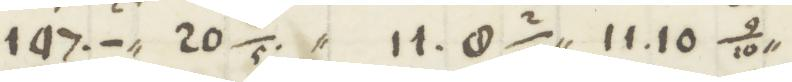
147.–„ 20 1/5. „ 11.8 2/15„ 11.10 9/10„
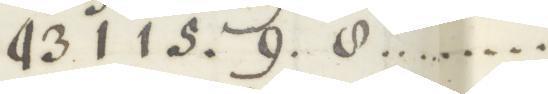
43115.9.8
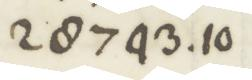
28743.10
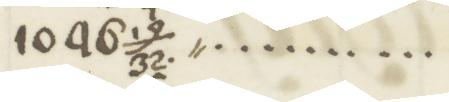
1046 2/. „ . . . . . . . . . .
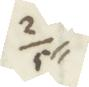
2/5„
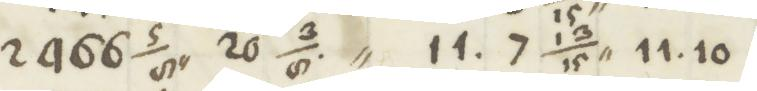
2466 5/8„ 20 3/5. „ 11.7 13/15„ 11.10
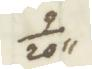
9/20„
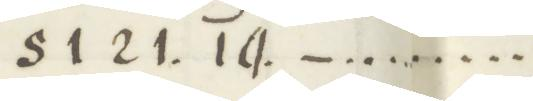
5121.14.-
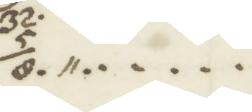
5/8.„
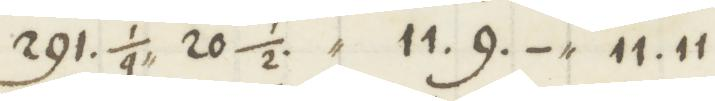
291. 1/4„ 20 ½. „ 11.9.-„ 11.11 23/40
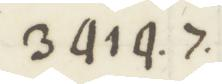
3414.7.
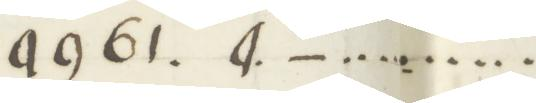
4961.4.-
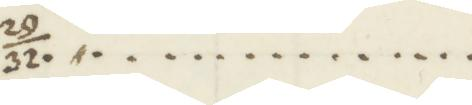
125 29/32.„ . . . . . . . . . . . . . - .
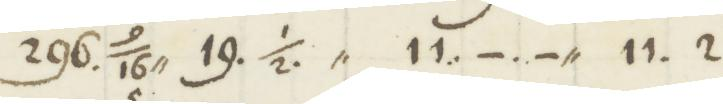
296. 9/16„ 19.½. „ 11.–.-„ 11.2.
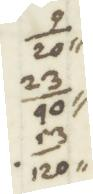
53/120„
